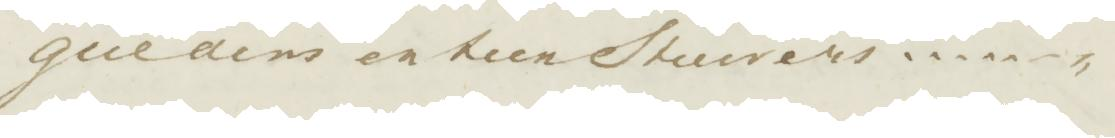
guldens en tien Stuivers - - - - - - „
